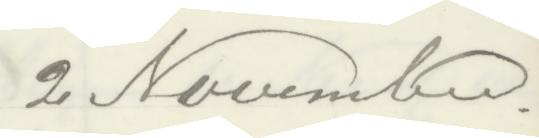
2 November.
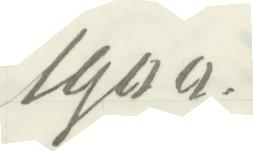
1900.
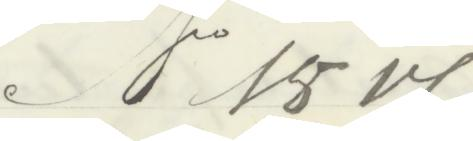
No 1517
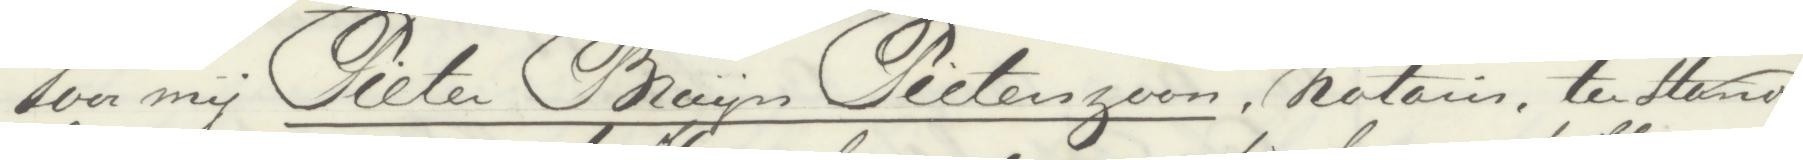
Voor mij Pieter Bruijn Pieterszoon, notaris, ter stand
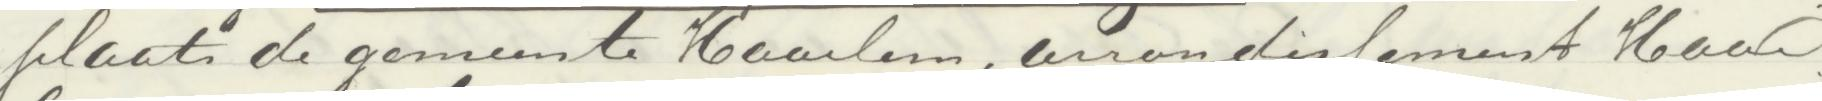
plaats de gemeente Haarlem, arrondissement Haar
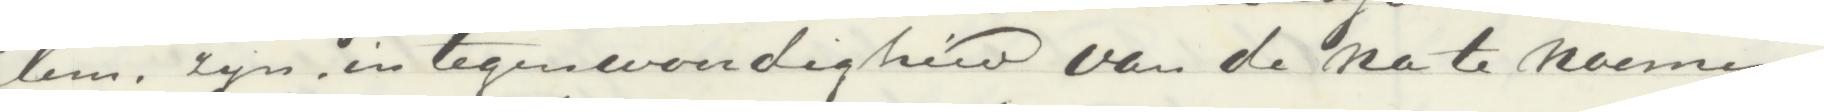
lem, zijn, in tegenwoordigheid van de na te noemen
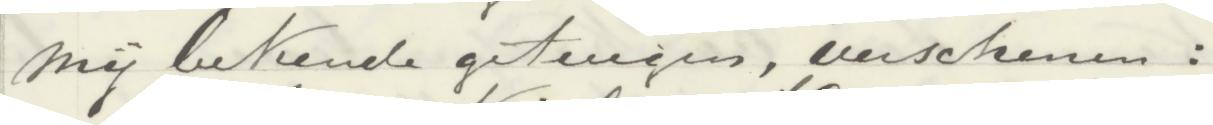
mij bekende getuigen, verschenen:
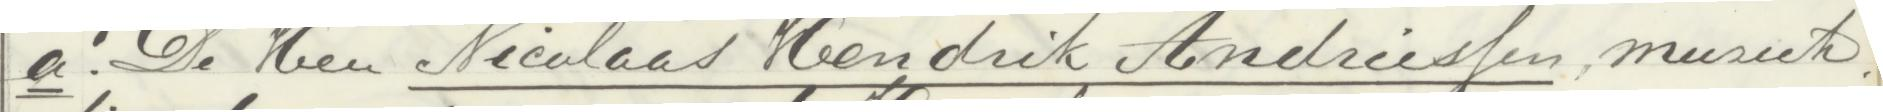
a. De Heer Nicolaas Hendrik Andriessen, muziek,
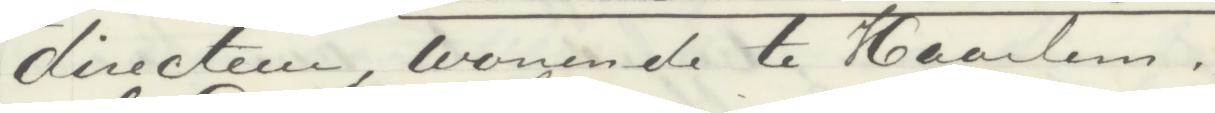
directeur, wonende te Haarlem.
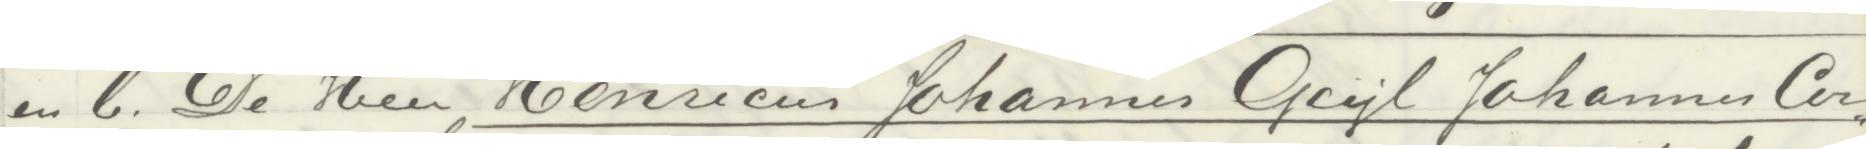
en b. De Heer Henricus Johannes Geijl Johannes Cor„
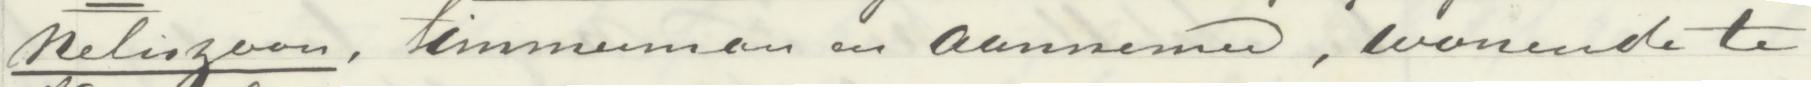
neliszoon, Timmerman en aannemer, wonende te
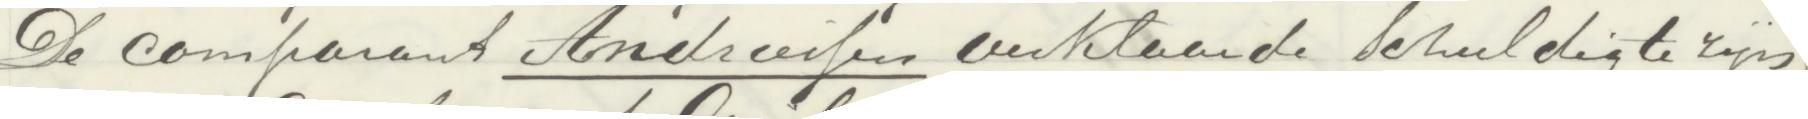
De Comparant Andriessen verklaarde schuldig te zijn
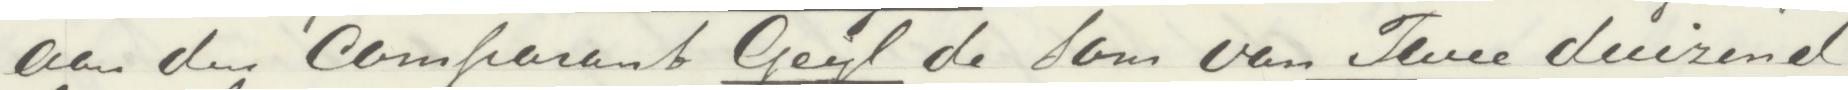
aan den Comparant Geijl de som van Twee duizend
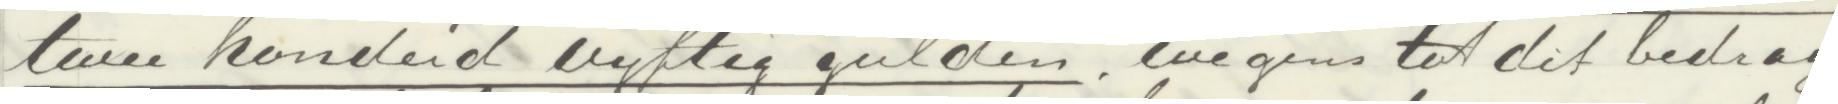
twee honderd vyftig gulden, wegens tot dit bedrag
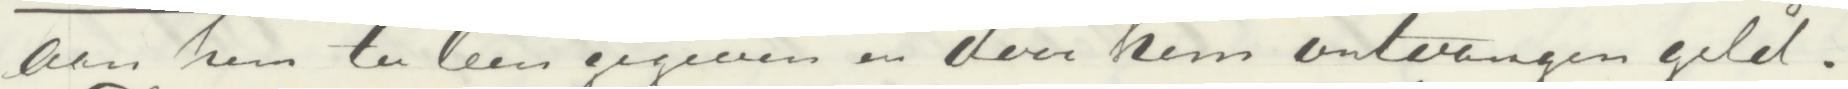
aan hem ter leen gegeven en door hem ontvangen geld.
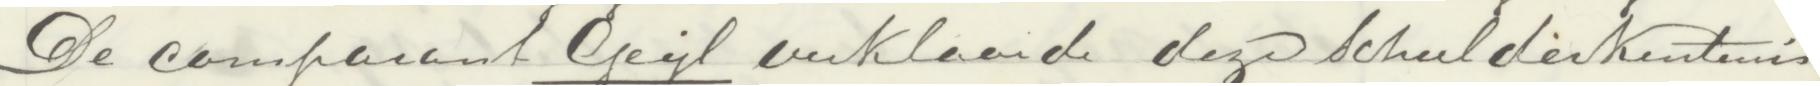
De comparant Geijl verklaarde deze schulderkentenis
